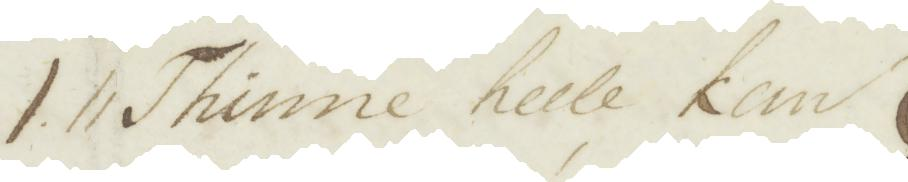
1. „ Thinne heele kan
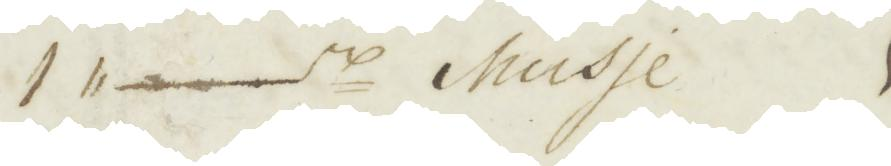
1 „ -:o musje
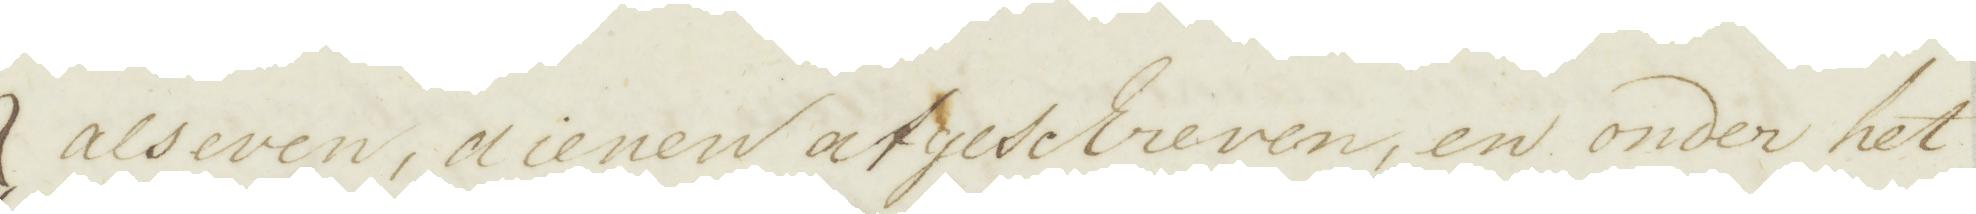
alseven, dienen afgeschreven, en onder het
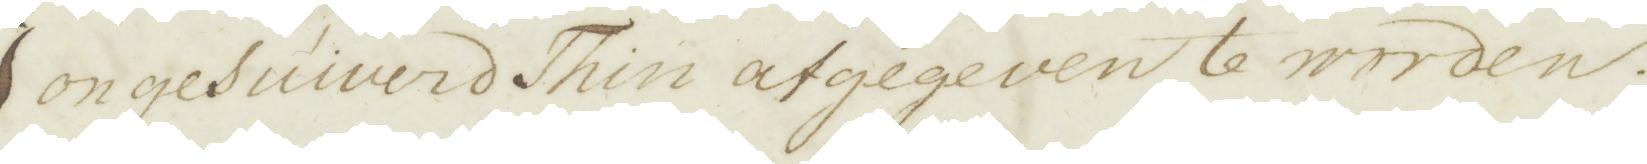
ongesuiverd Thin afgegeven te worden.
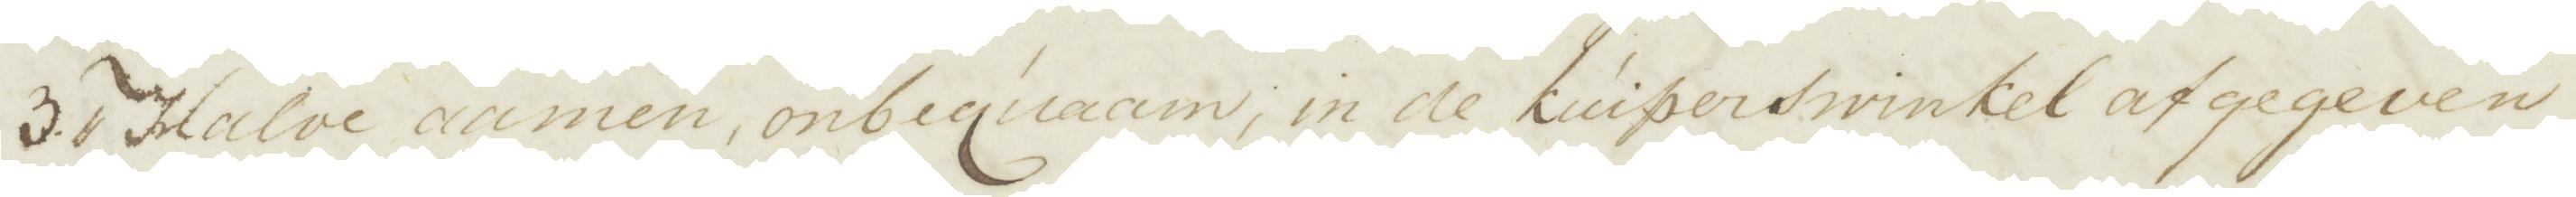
3. „ Halve aamen, onbequaam; in de kuiperswinkel afgegeven
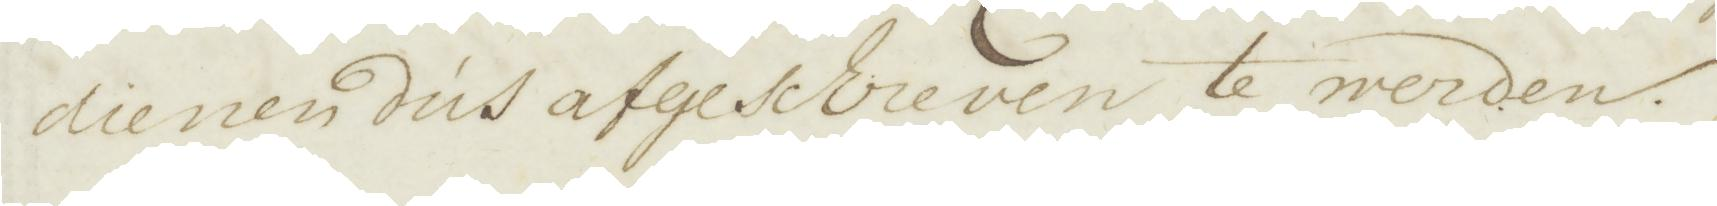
dienen dus afgeschreven te werden.
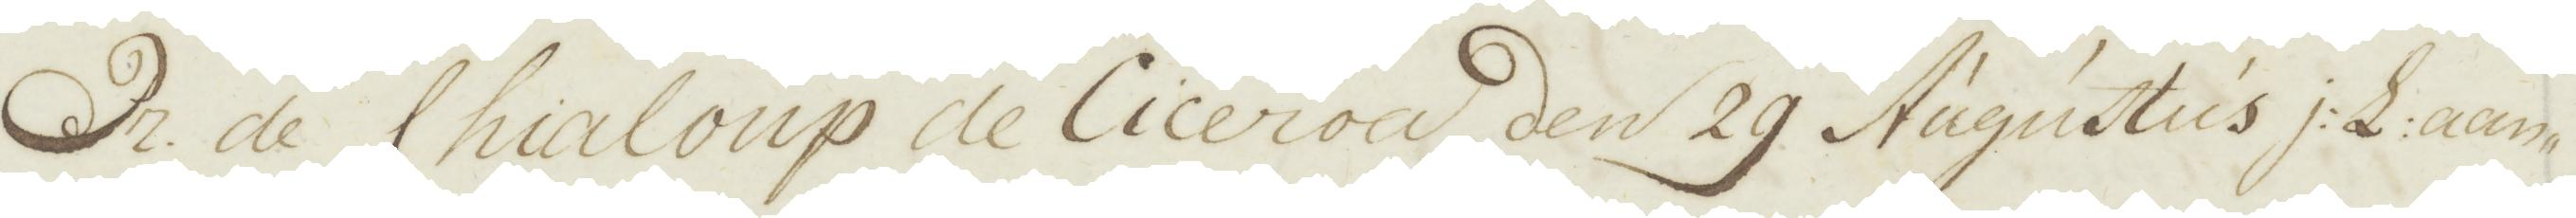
Pr. de Chialoup de Ciceroa den 29 Augustus j: L: aan„
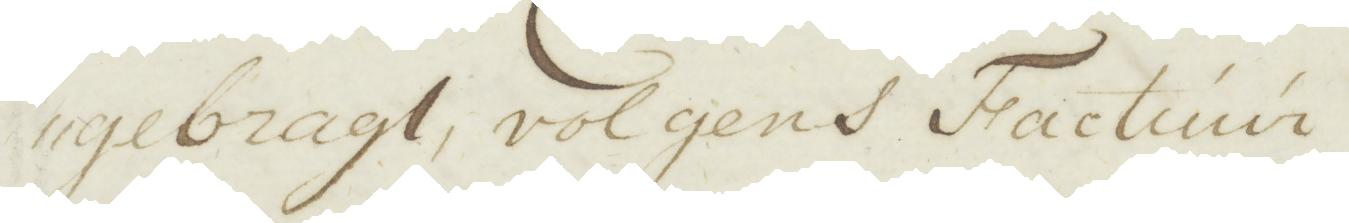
„gebragt, volgens Factuur
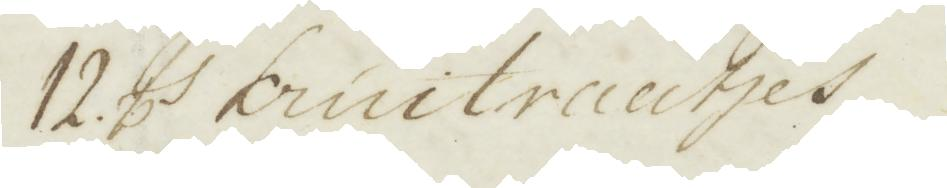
12. ps kruitvaatjes
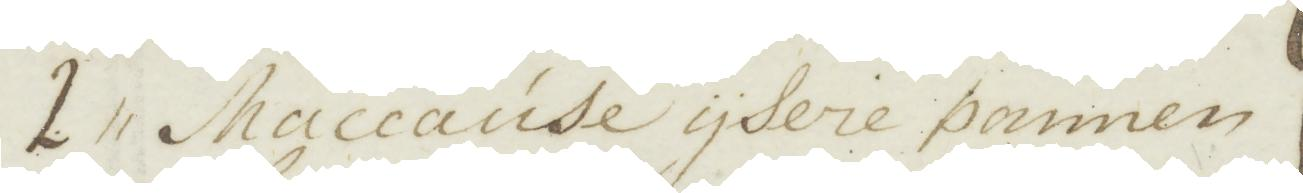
2 „ Macccause ijsere pannen
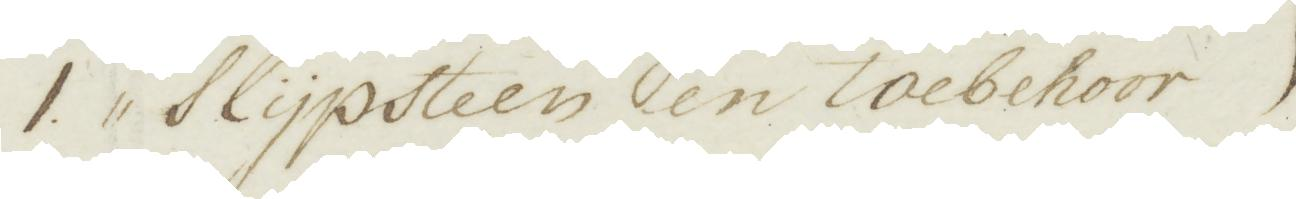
1. „ Slijpsteen en toebehoor
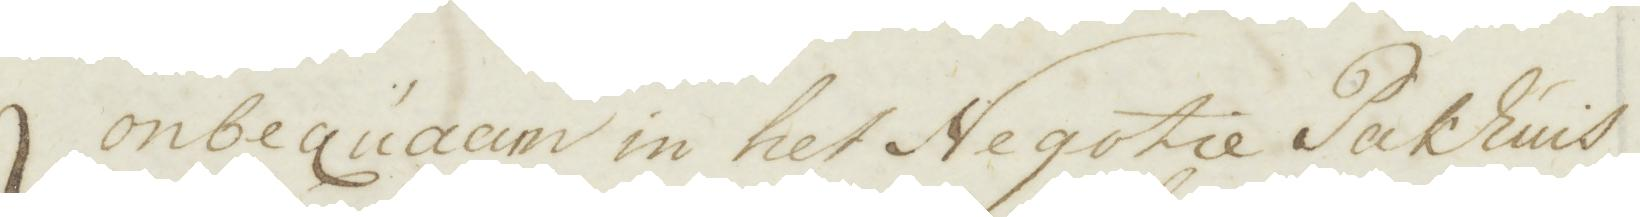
onbequaam in het Negotie Pakhuis
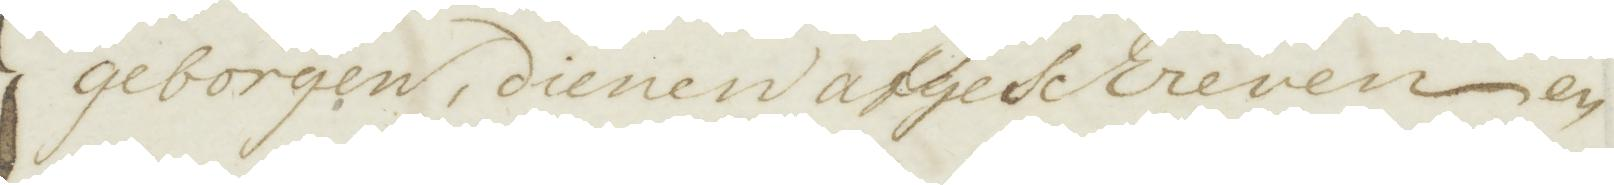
geborgen, dienen afgeschreven en
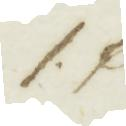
1. /
